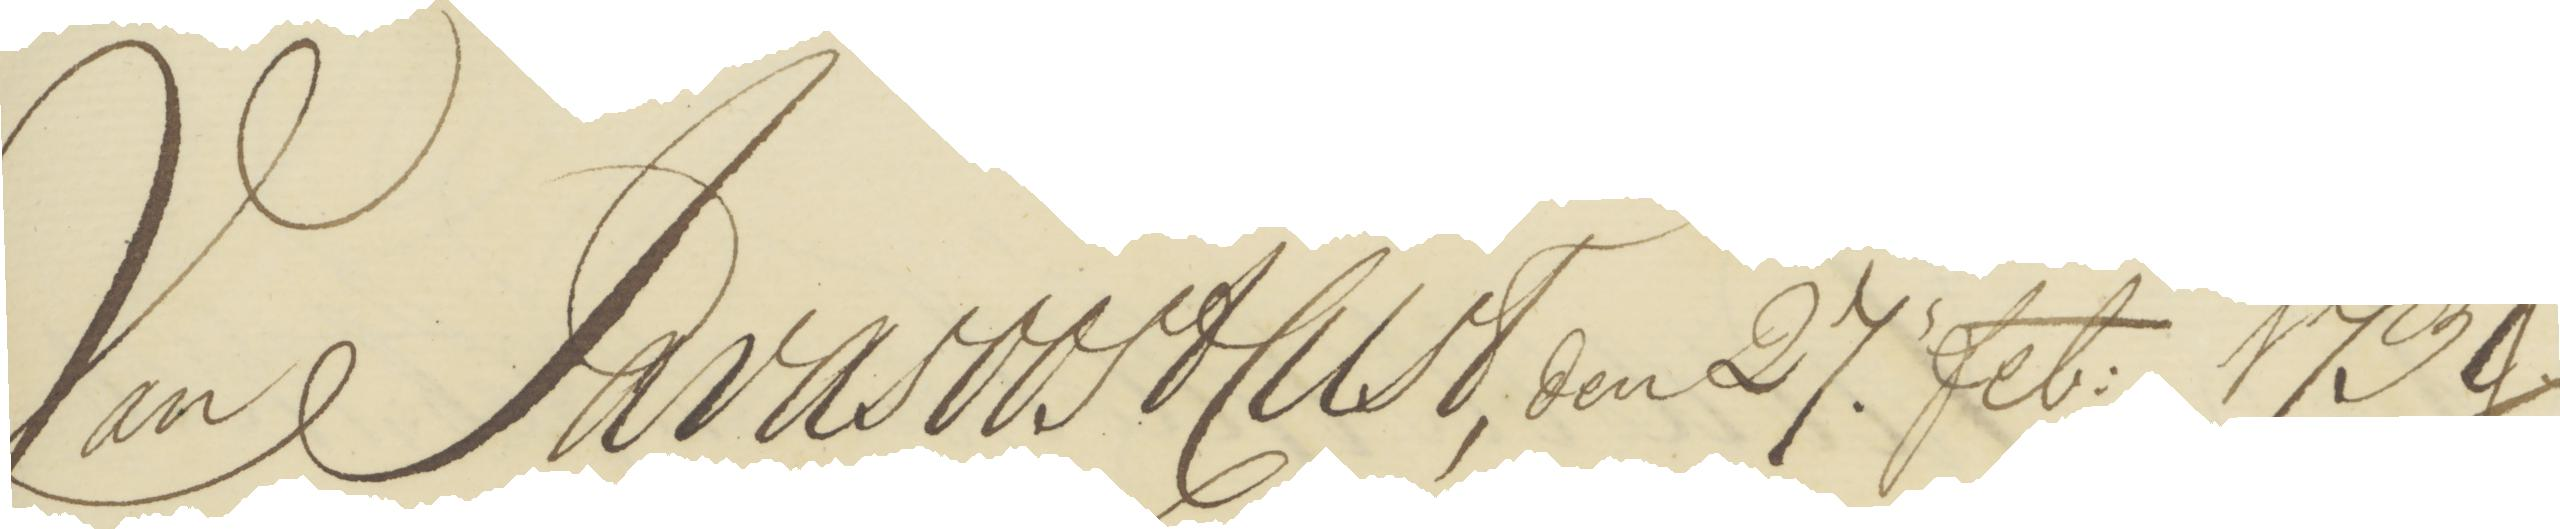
Van JavasoostCust, den 27.' feb:, 1734.
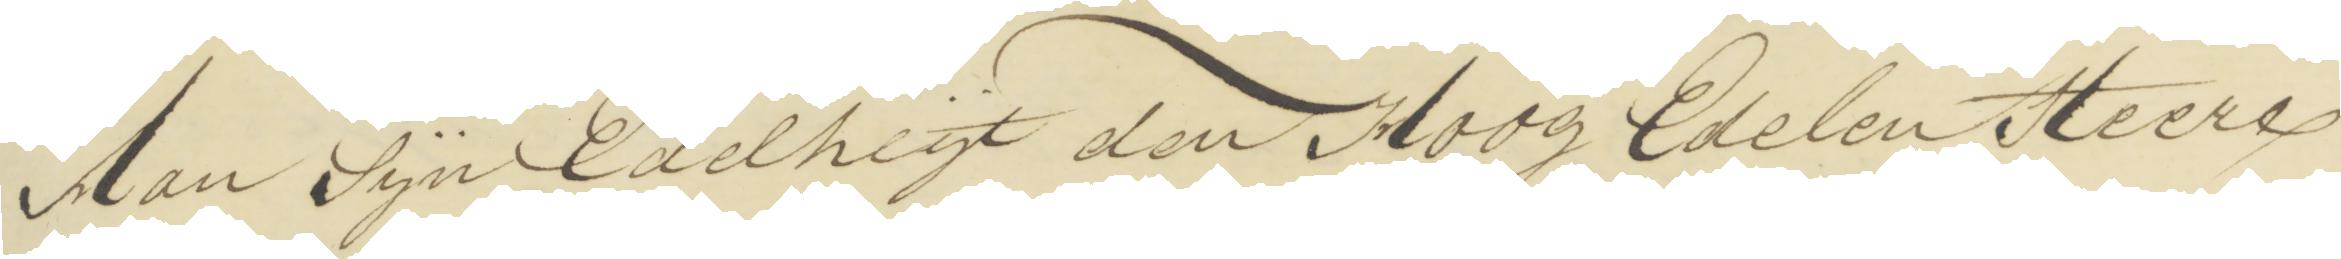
Aan sijn Edelheijt den Hoog Edelen Heere
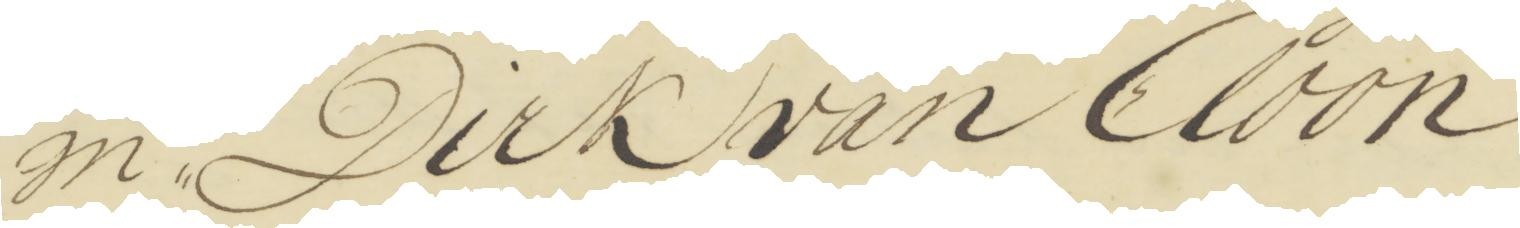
m„r Dirk van Cloon
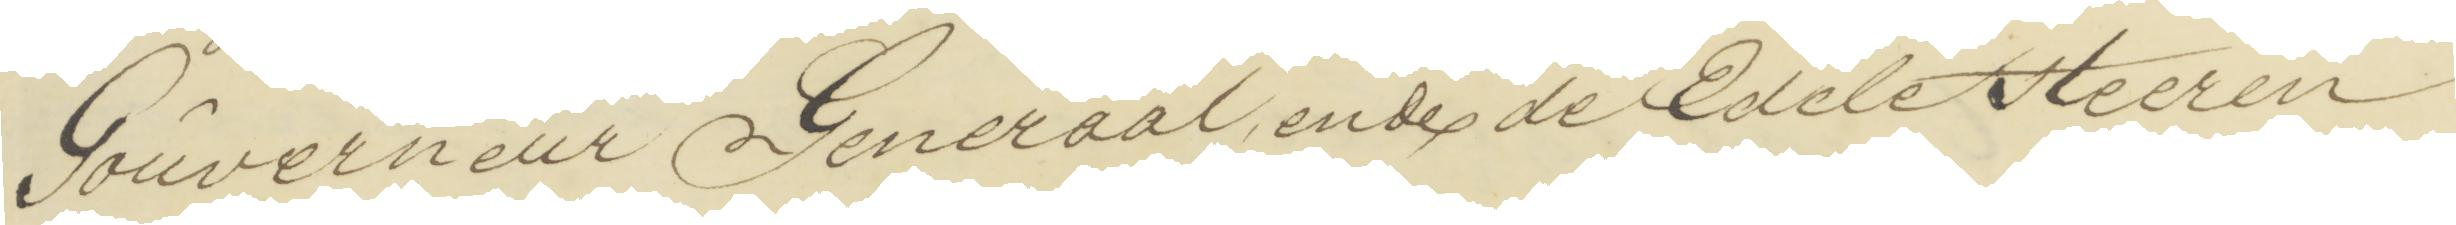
Gouverneur Generaal, ende de Edele Heeren
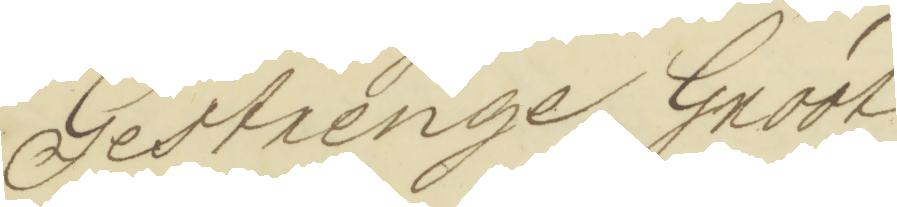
Gestrenge, Groot
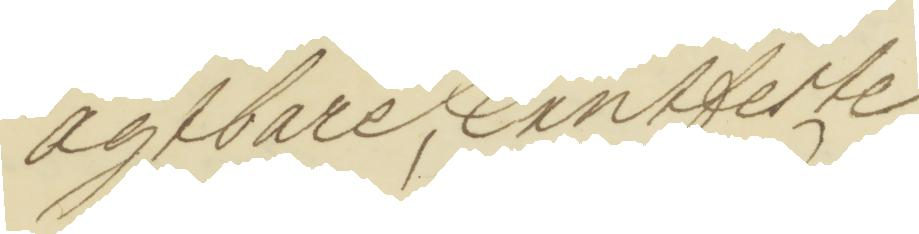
agtbare, Erntfeste,
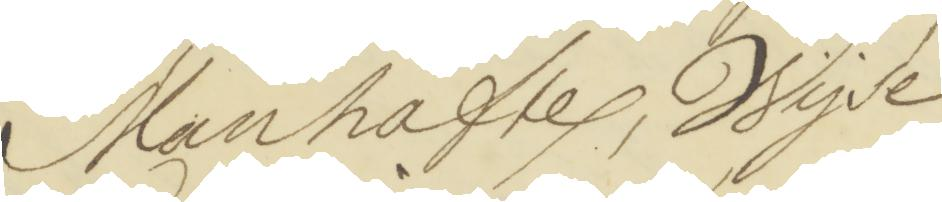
Manhafte, Wijse
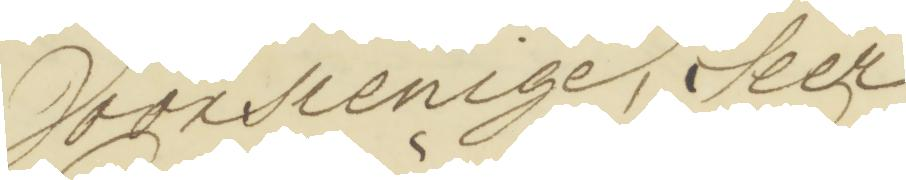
Voorsienige, seer
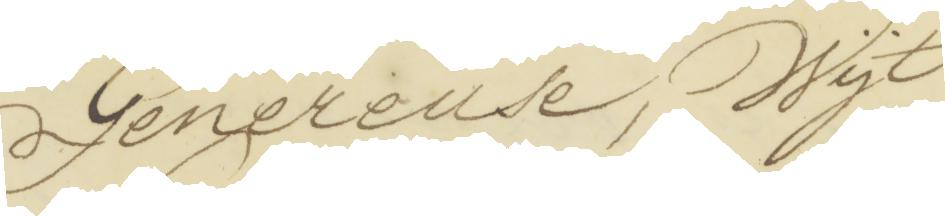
Genereuse, Wijt
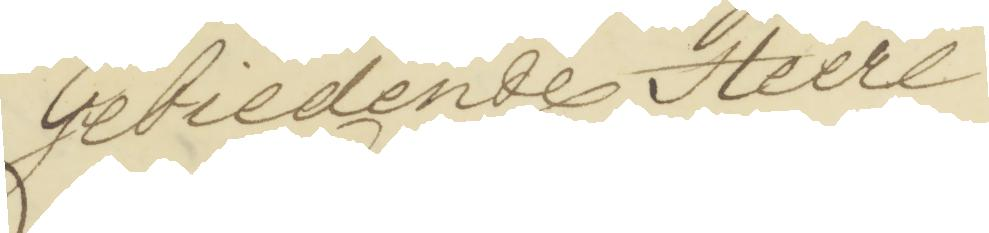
Gebiedende Heere,
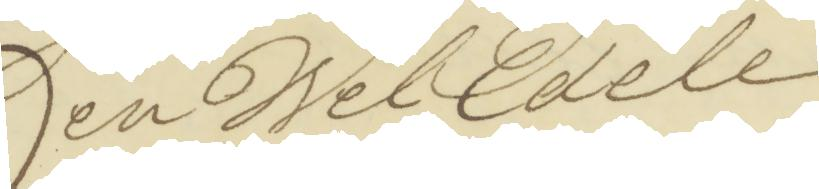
en Wel Edele
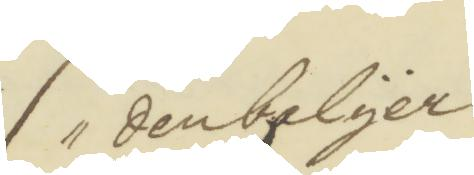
P„r den balijer
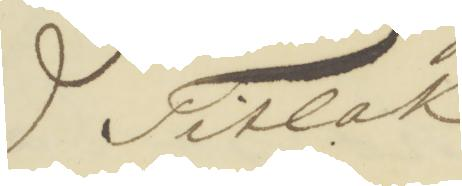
Titlak
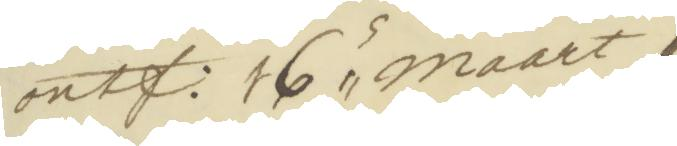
ontf: 16„' maart
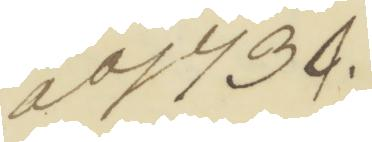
ao 1734.
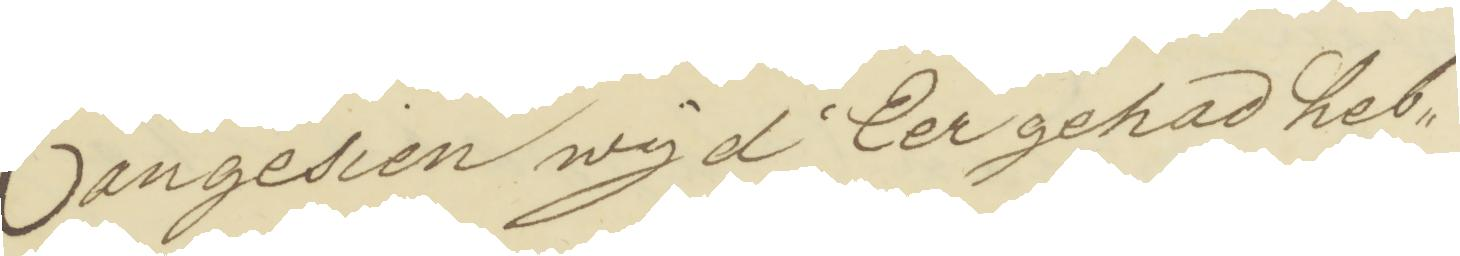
Aangesien wij d' Eergehad heb„
